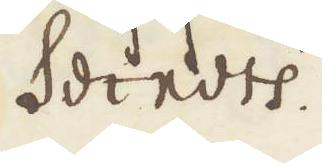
secrets.
